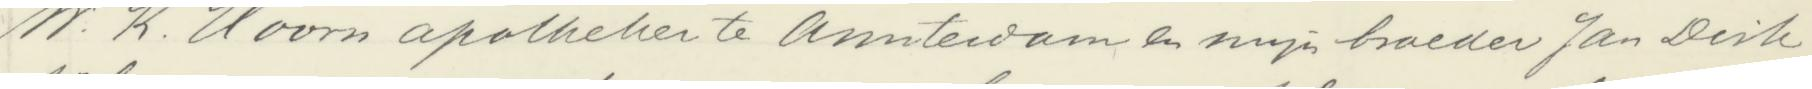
W. K. Hoorn apotheker te Amsterdam en mijn boeder Jan Dirk
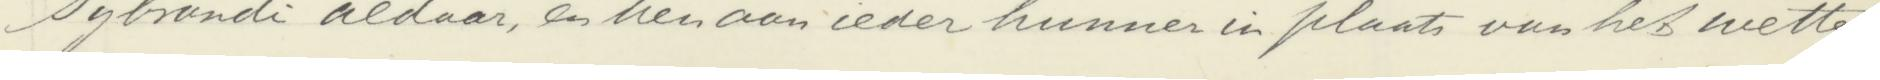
Sijbrandi aldaar, en hen aan ieder hunner in plaats van het wette
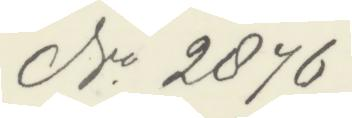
N.o 2876
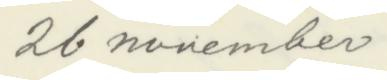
26 november
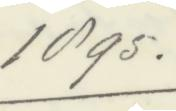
1895.
